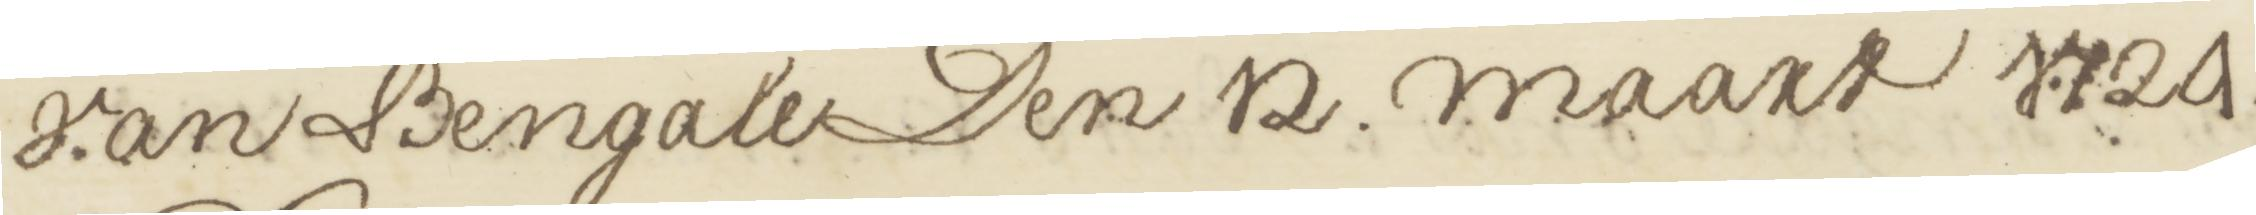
Van Bengale Den 12. maart 1724.
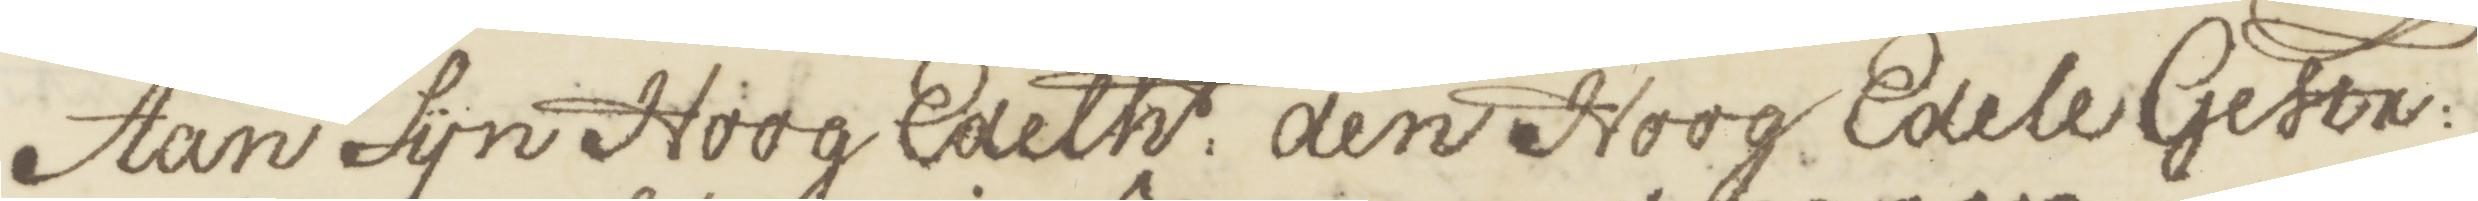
Aan Sijn Hoog Edelh:t den Hoog Edele Gestr:
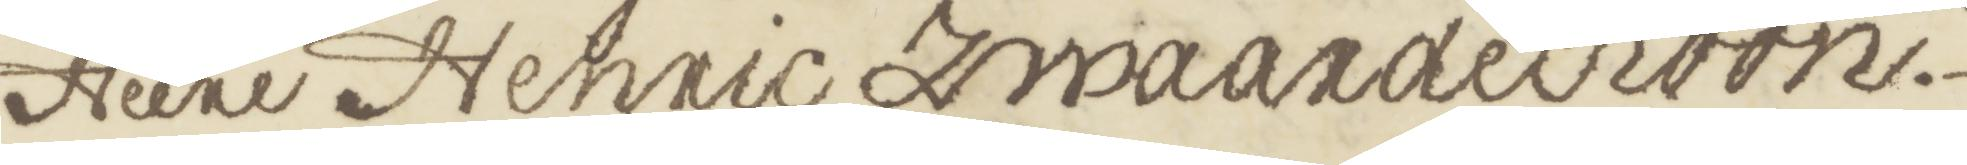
Heere Henric Zwaardecroon.
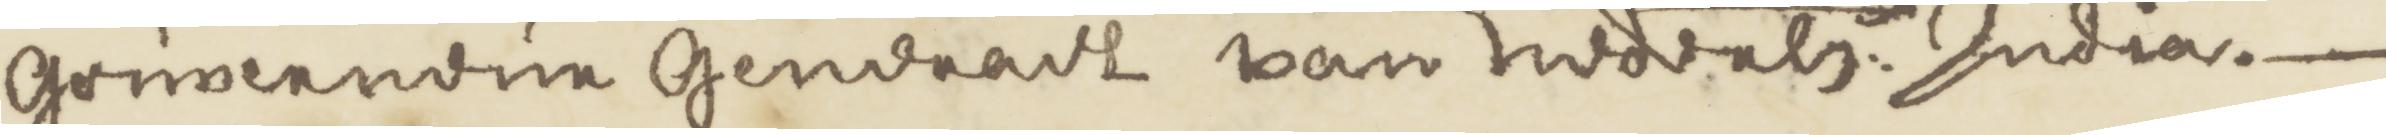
gouverneur generael van nederl:s Jndia.
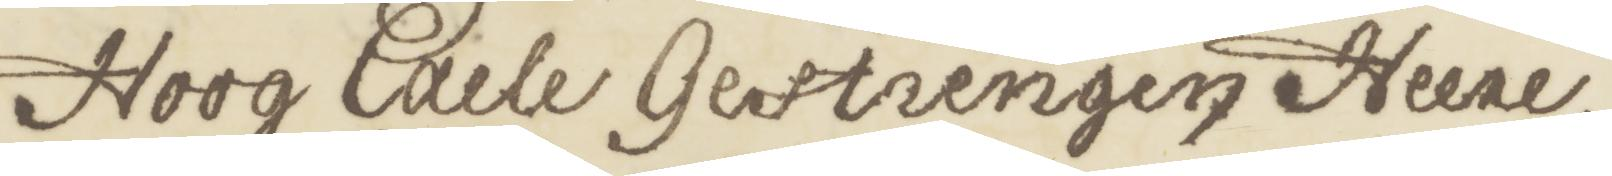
Hoog Edele Gestrengen Heere,
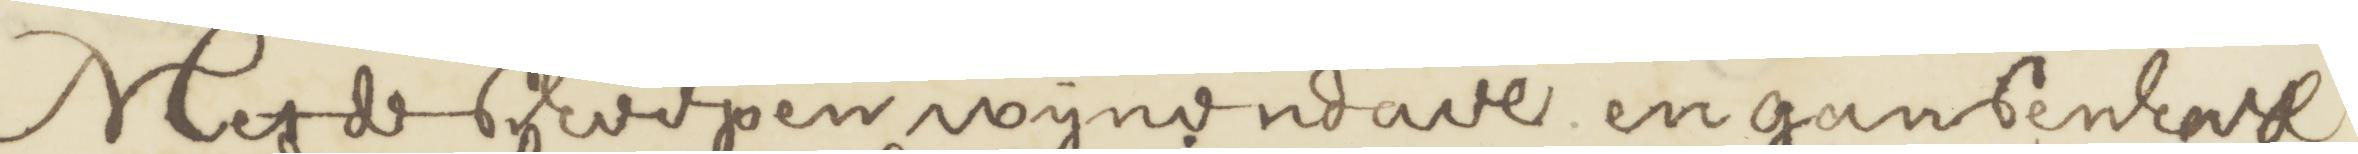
Met de scheepen wijnendael en gansenhoek
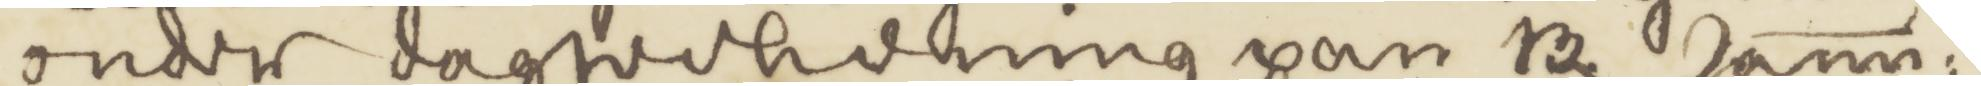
onder dagteekening van 13 Jann:
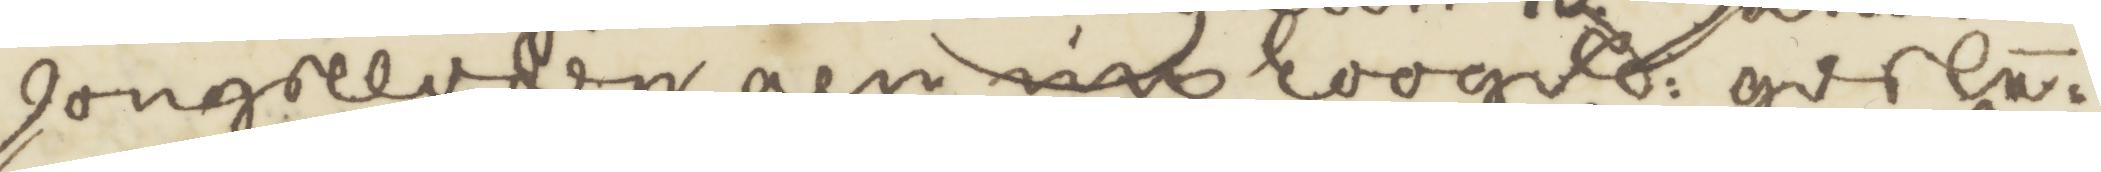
Jongstleden aen uw hoogEd: gestr:
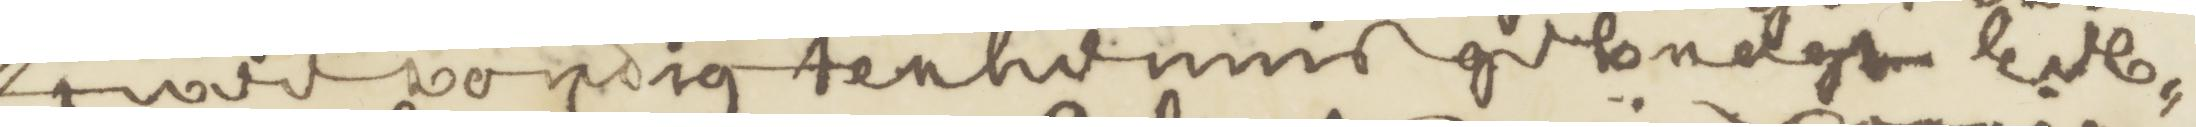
tweevoudig terkennis gebragt heb„
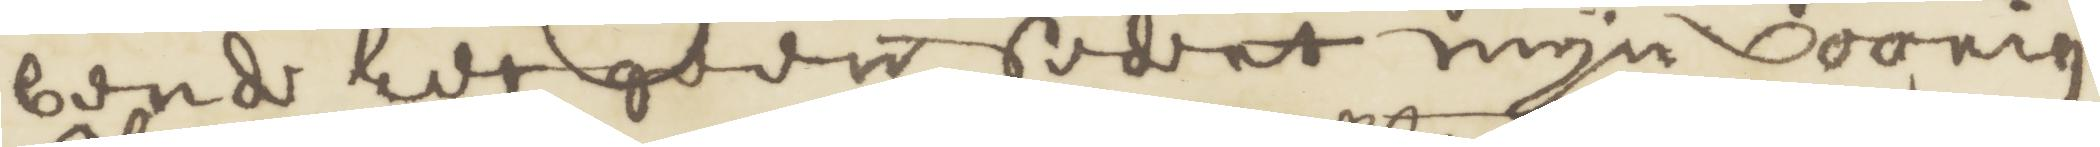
bende het geen sedert mijn voorig
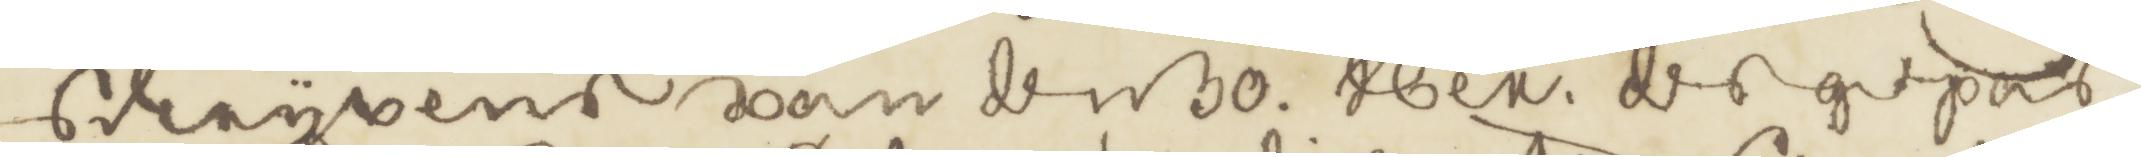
schrijvens van den 30. 8ber: des gepas
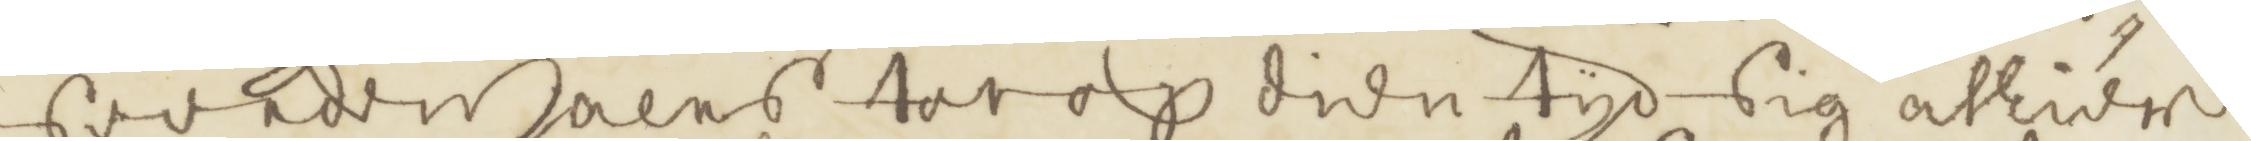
seerden Jaers tot op dien tijd sig alhier
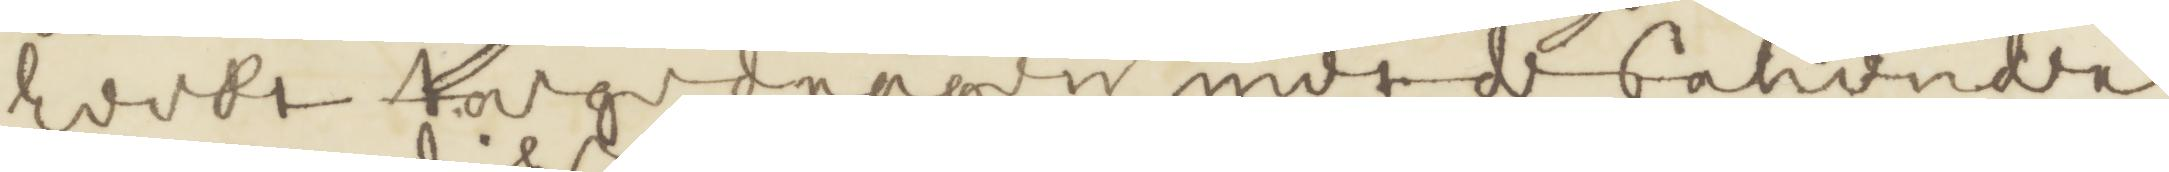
heeft toegedragen met de saken der
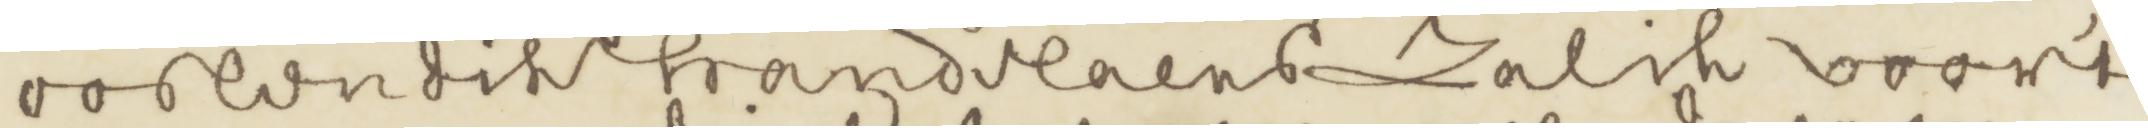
oostendise handelaers zal ik voor’t
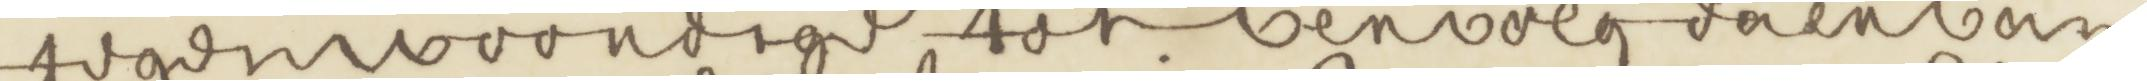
tegenwoordige tot vervolg daervan
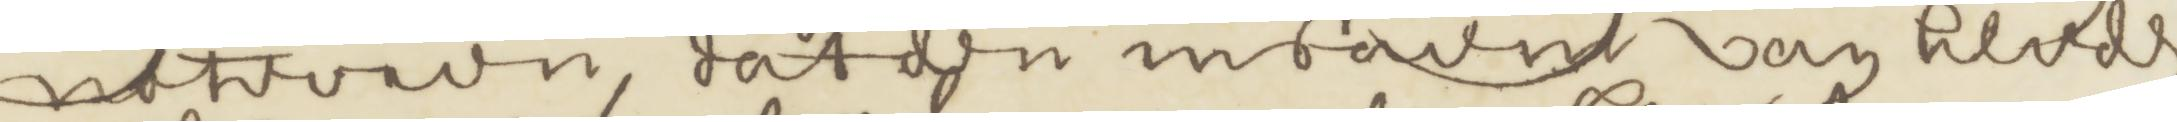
noteeren dat den insaem van kleden
